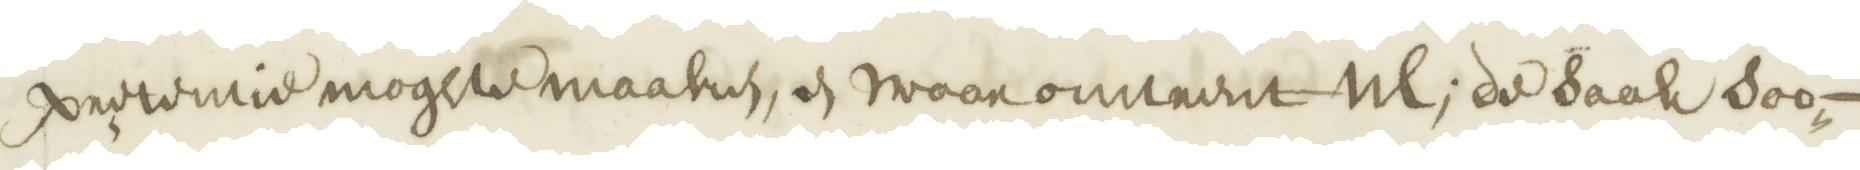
pretentie moghte maaken, en waar omtrent UE: de saak soo„
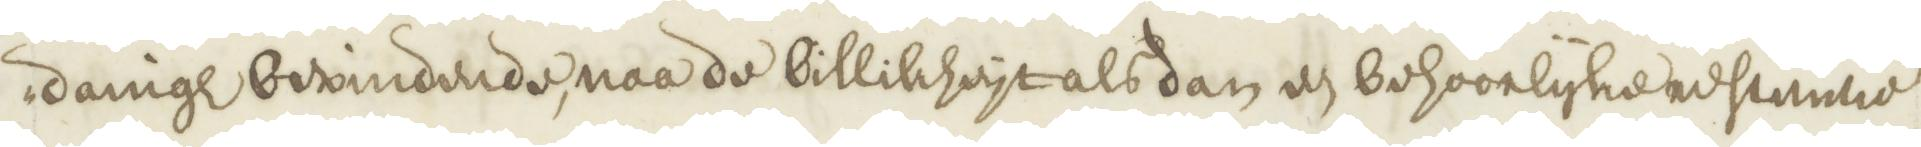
„danigh bevindende, naa de billikheijt als dan een behoorlijke restitutie
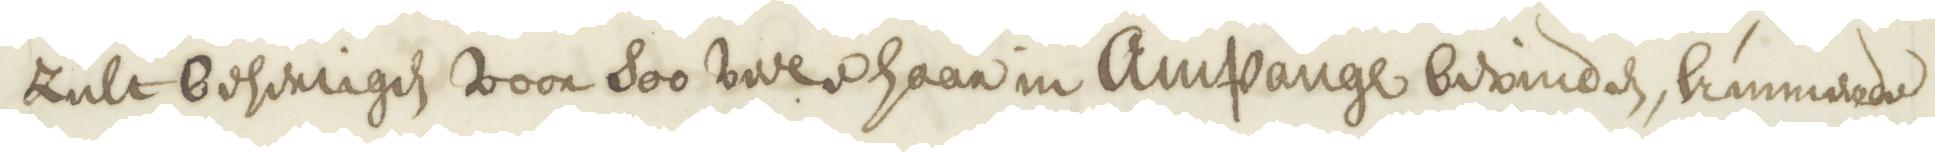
zult behertigen voor soo veele haar in Ampange bevinden, kunnende
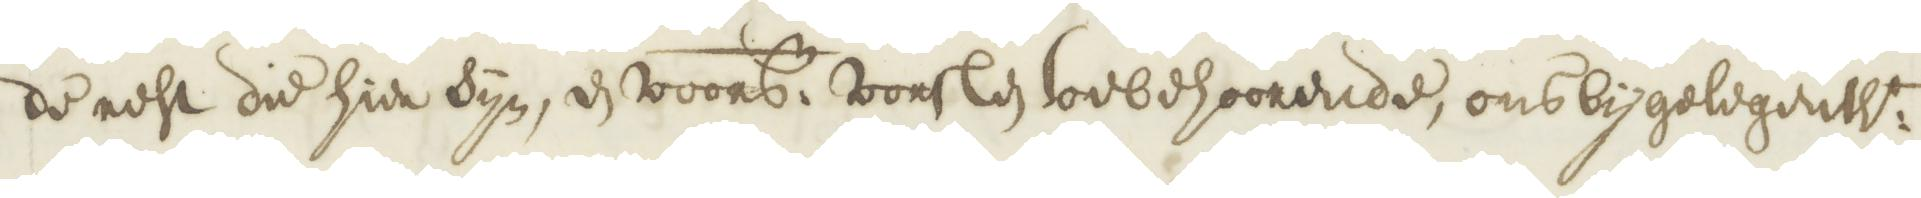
de rest die hier sijn, en voors:z vorsten toebehoorende, ons bij gelegenth:t
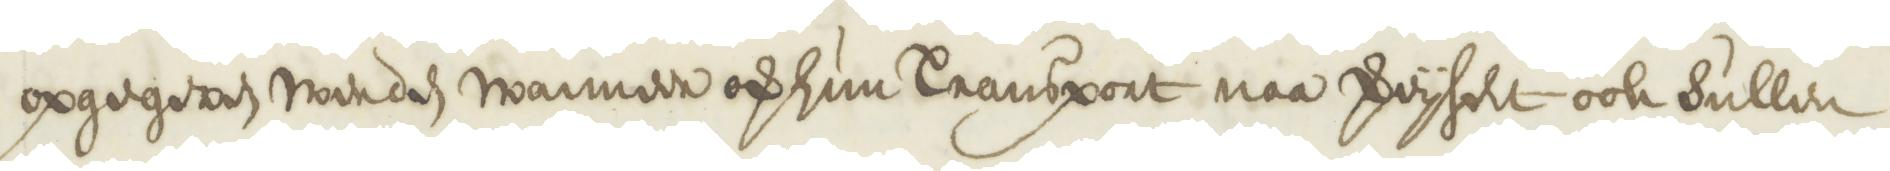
opgegeven werden wanneer over hun transport naa vereijscht ook sullen
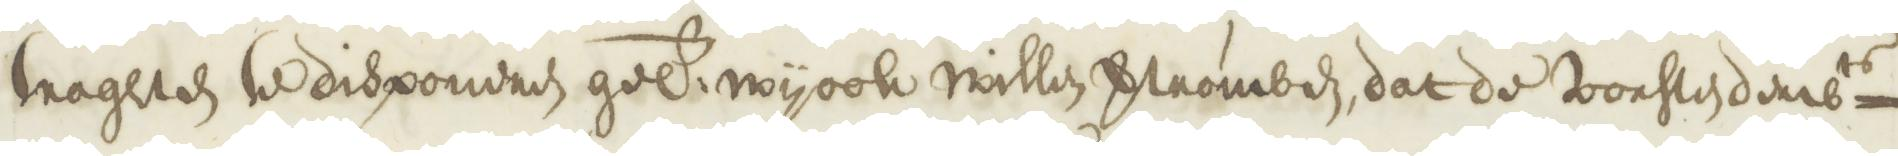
traghten te disponeren gelijk wij ook willen vertrouwen, dat de vorsten derw=ts
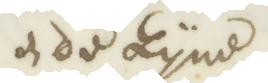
en de zijne
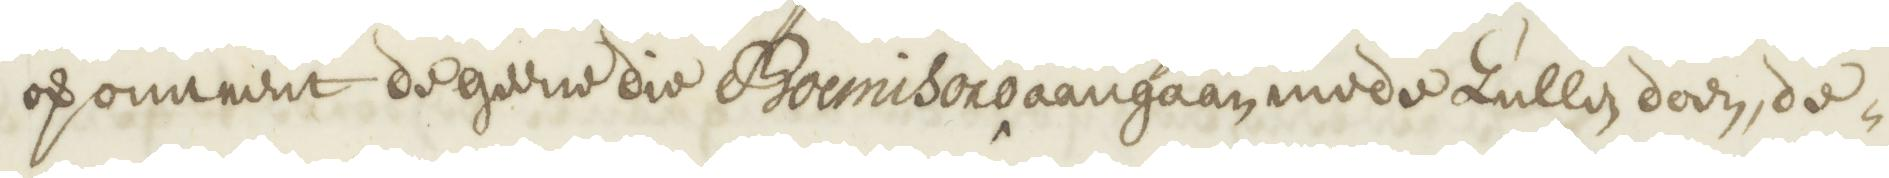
over omtrent de geene die Boemisoro ^ aangaan mede zullen doen, de„
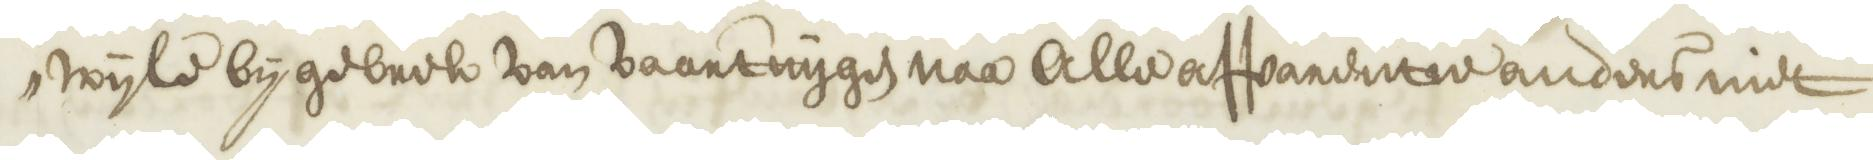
„wijle bij gebrek van vaartuijgen naa alle apparentie anders niet
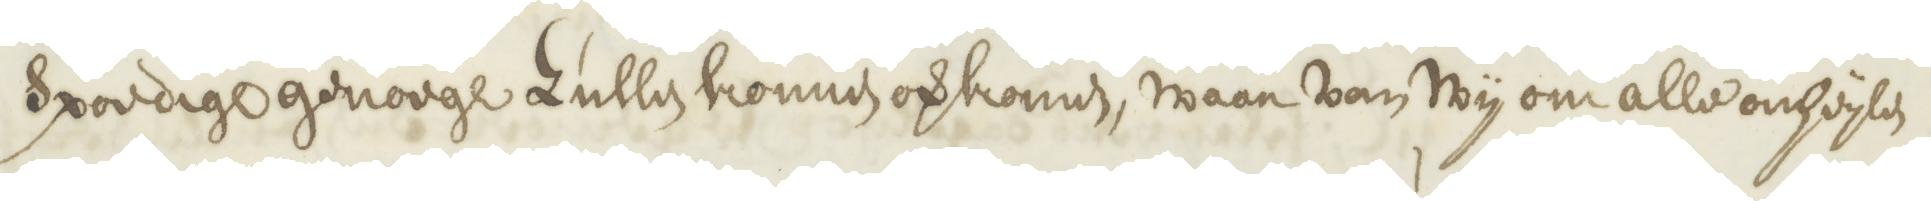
spoedigh genoegh zullen konnen overkomen, waar van wij om alle onheijlen
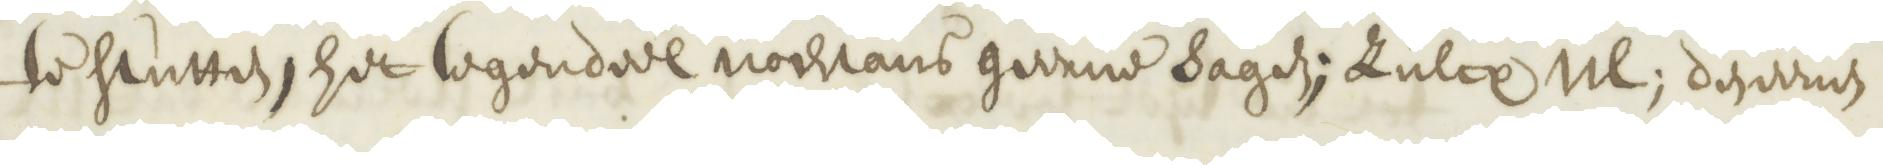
te stutten, het tegendeel nochtans geerne sagen; zulcx Ul; den eenen
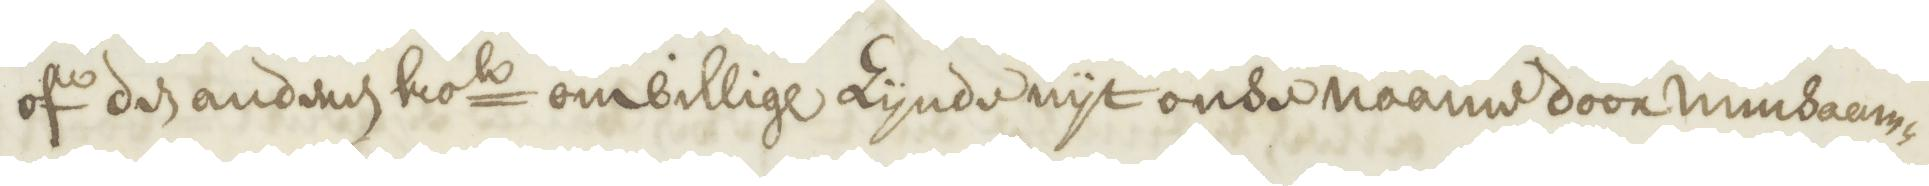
of den anderen ko=k ombillige zijnde uijt onse naame door minsaam„
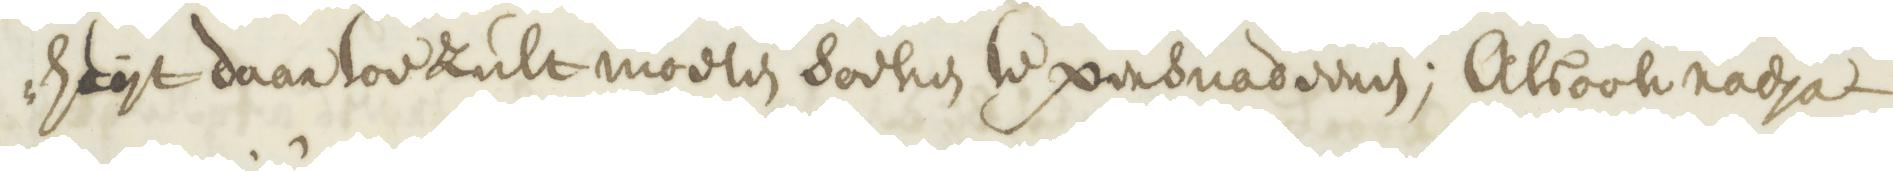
„heijt daar toe zult moeten soeken te persuadeeren; Alsook radja —
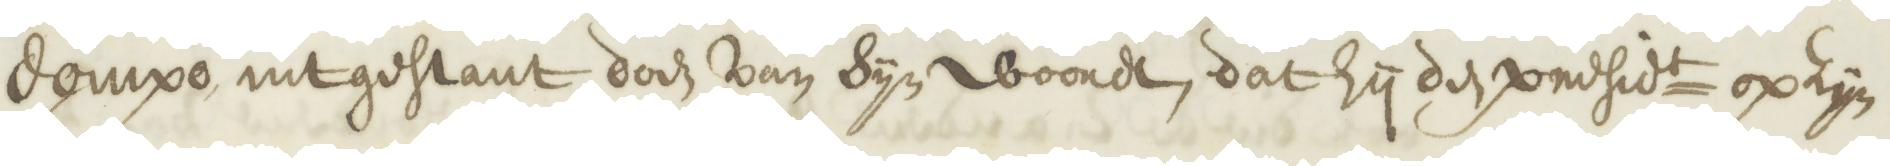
dompo, in't gestant doen van sijn woordt, dat hij den presid=t op zijn
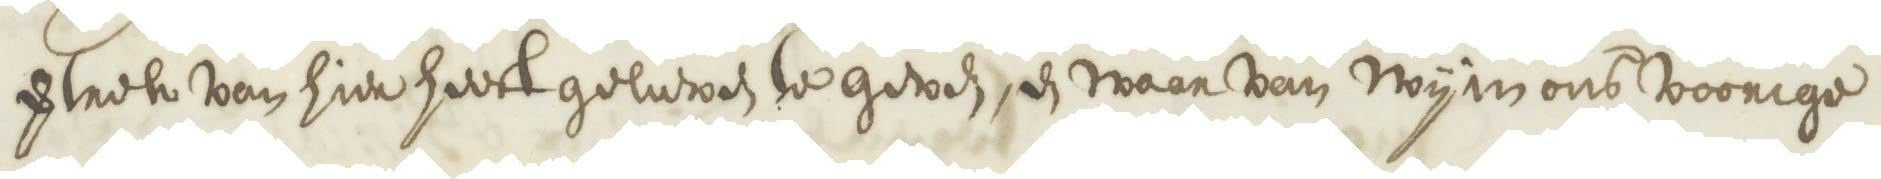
vertrek van hier heeft gelieven te geven, en waar van wij in ons voorige
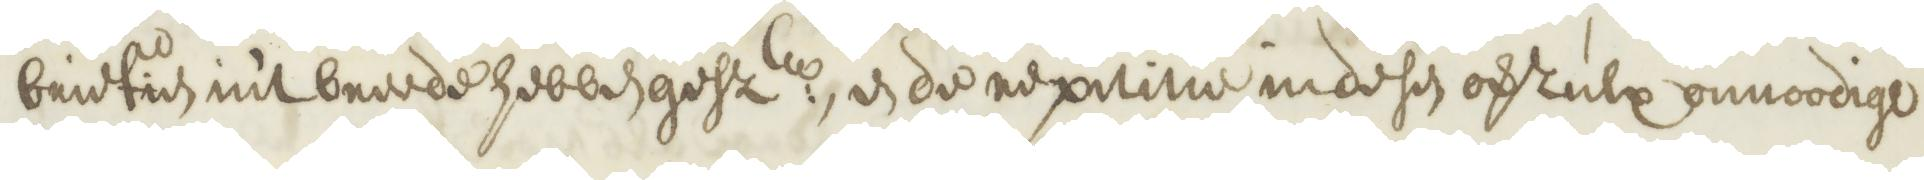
briefien in’t breede hebben gesz: en de repititie in desen over zulx onnoodige
